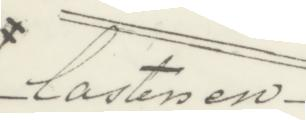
-Lasten en-
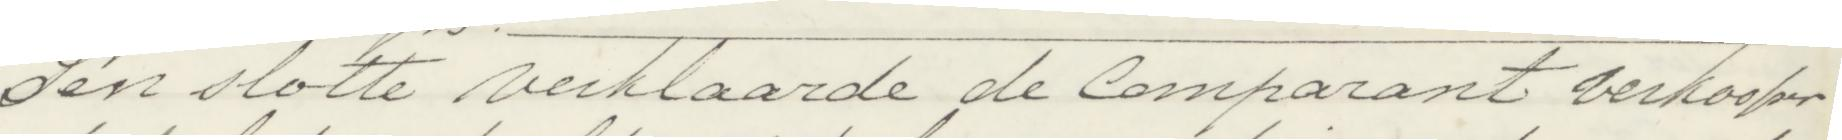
Ten slotte verklaarde de Comparant verkooper
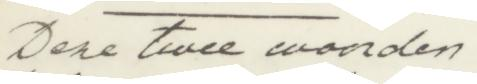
Deze twee woorden
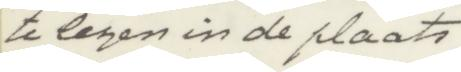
te lezen in de plaats
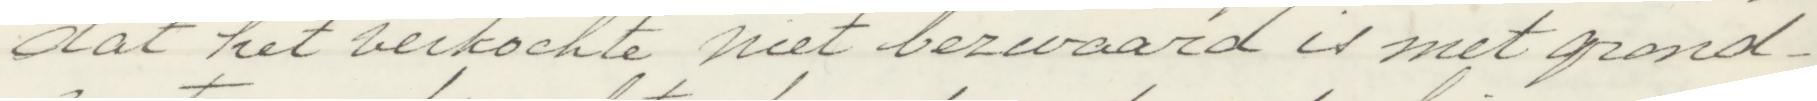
dat het verkochte niet bezwaard is met grond-
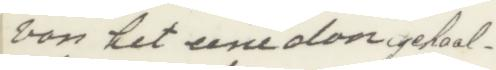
van het eene doorgehaal-
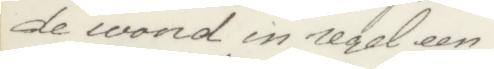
de woord in regel een
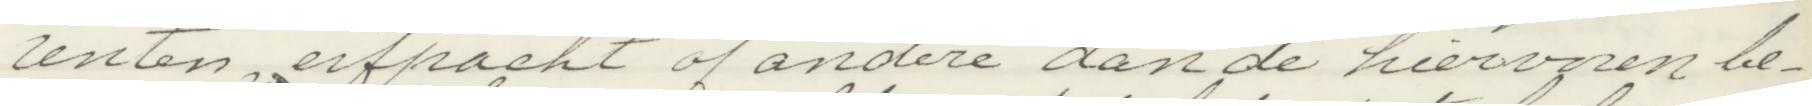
renten, erfpacht of andere dan de hiervoren be„
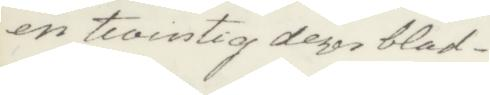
en twintig dezer blad-
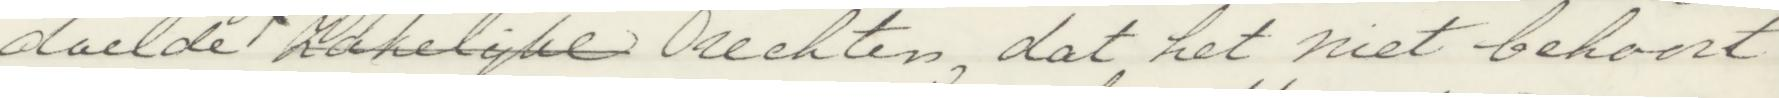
doelde ¶ zakelijke rechten dat het niet behoort
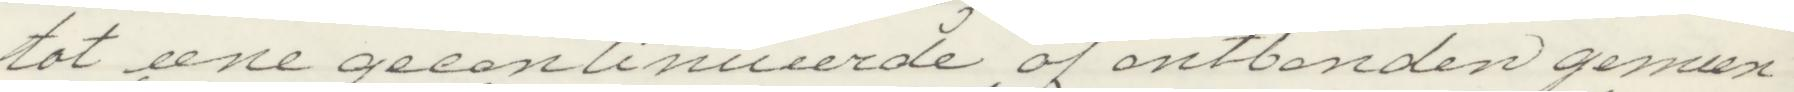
tot eene gecontinueerde of ontbonden gemeen
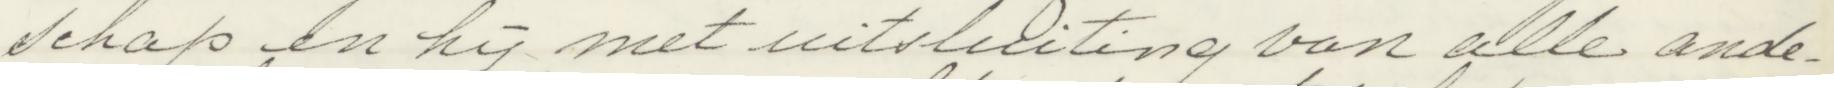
schap en hij met uitsluiting van alle ande-
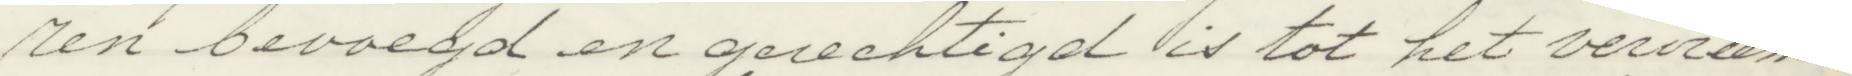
ren bevoegd en gerechtigd is tot het vervreem-
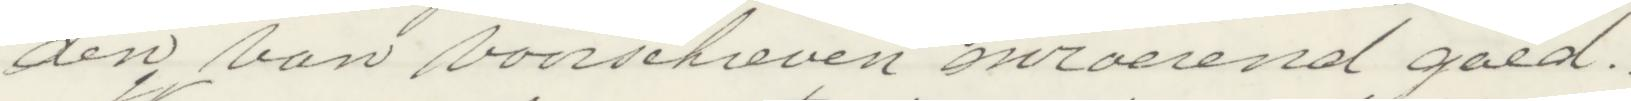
den van voorschreven onroerend goed.
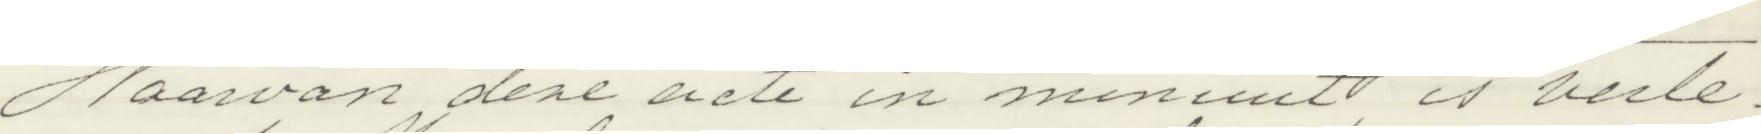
Waarvan deze acte in minuut is verle-
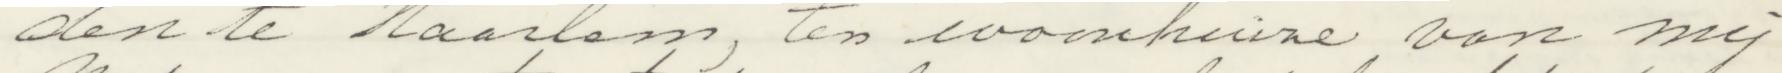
den te Haarlem, ten woonhuize van mij
